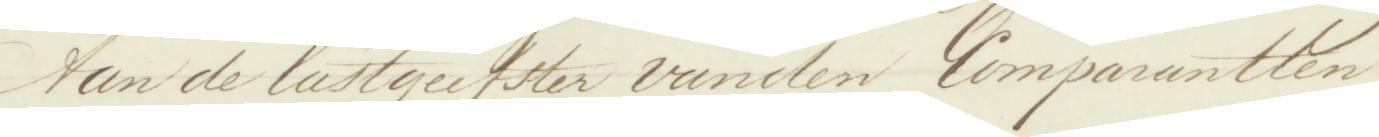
Aan de lastgeefster van den Comparantten
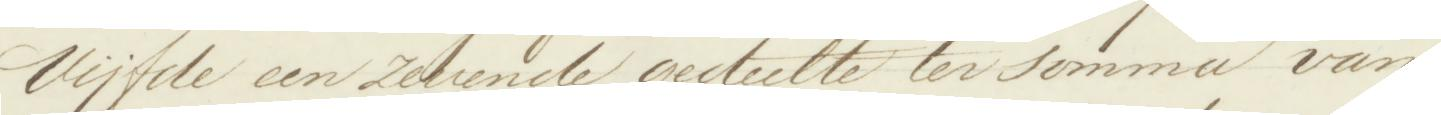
Vijfde een zevende gedeelte ter somma van
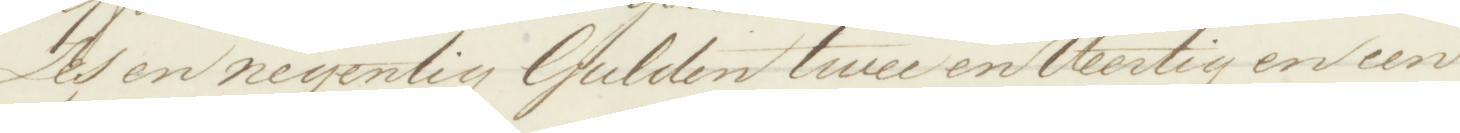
Zes en negentig Gulden twee en Veertig en een
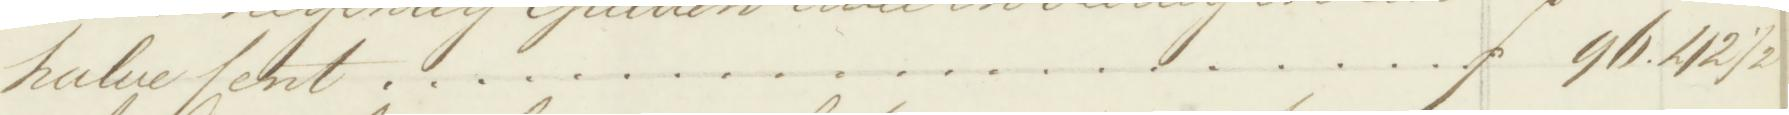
halve Cent . . . . . . . . . . . . . . . . . . . . . . . ƒ 96.42½
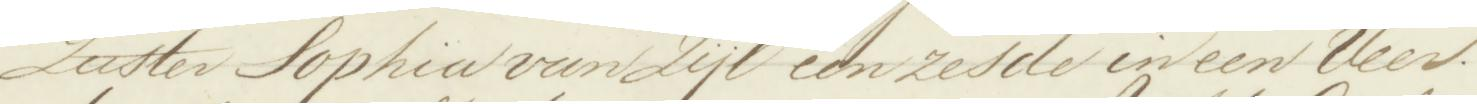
Zuster Sophia van Zijl een zesde in een Veer.
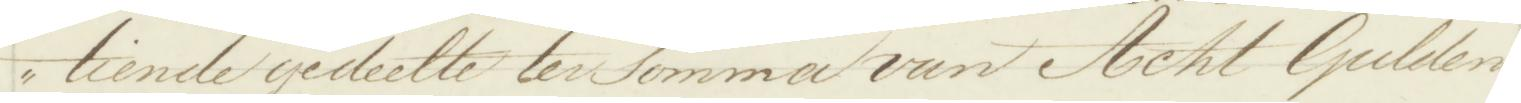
„ tiende gedeelte ter somma van Acht Gulden
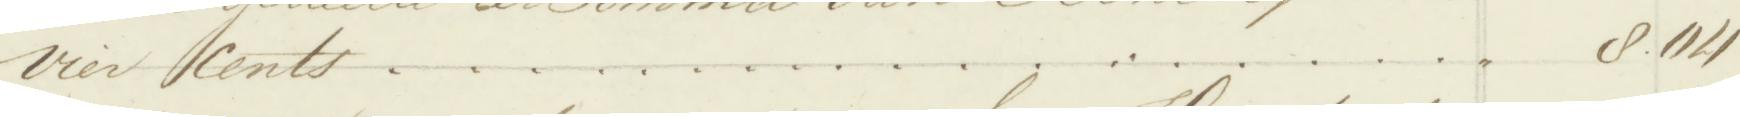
Vier Cents . . . . . . . . . . . . .. . . . . . „ 8. 04
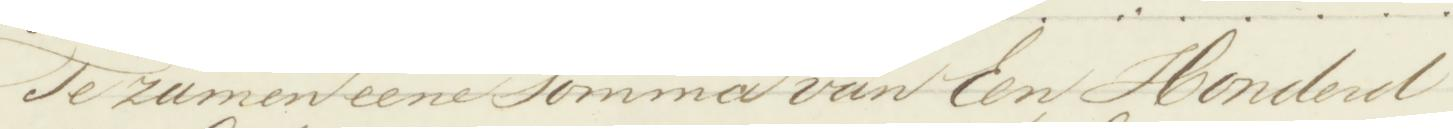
Te zamen eene somma van Een Honderd
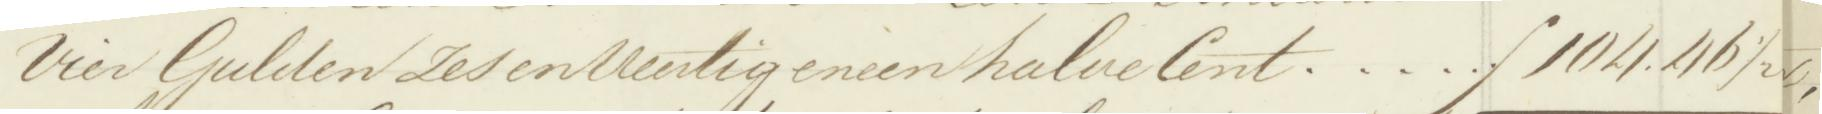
Vier Gulden zes en Veertig en een halve Cent . . . . . ƒ 104.46½
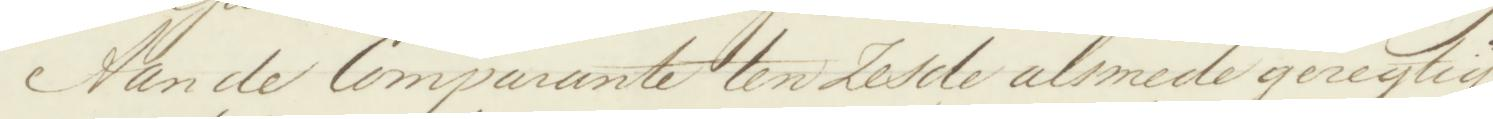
Aan de Comparante ten Zesde alsmede geregtig
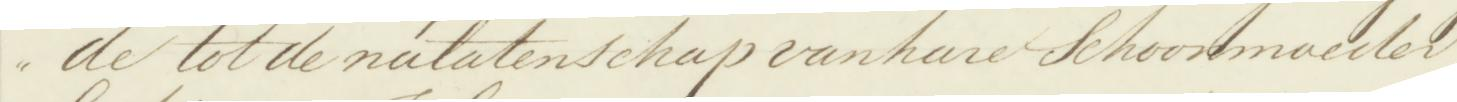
„ de tot de nalatenschap van hare schoonmoeder
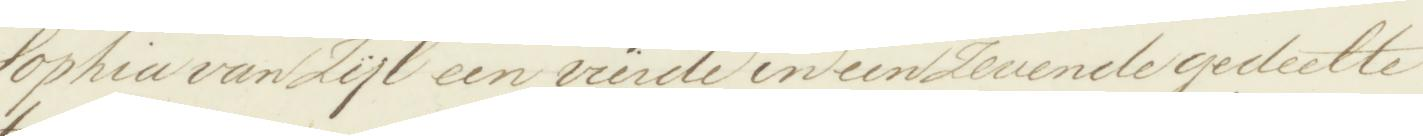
Sophia van Zijl een vierde in een Zevende gedeelte
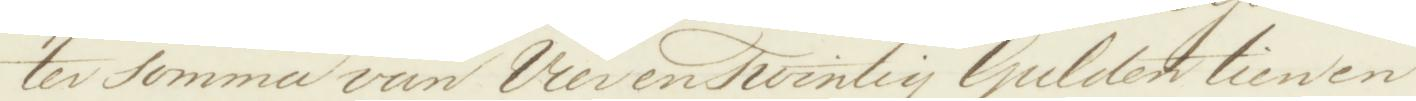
ter somma van Vier en Twintig Gulden tien en
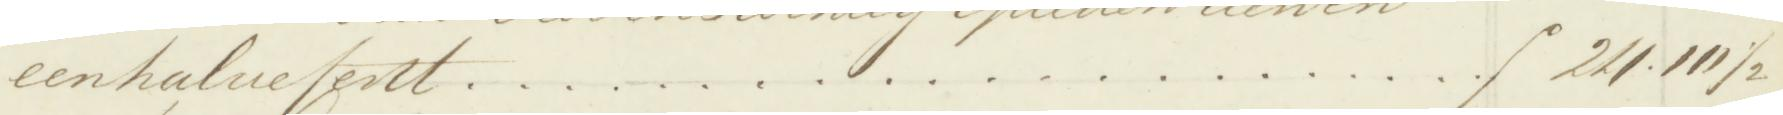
een halve Cent . . . . . . . . . . . . . . . . . . . . . ƒ 24.10½
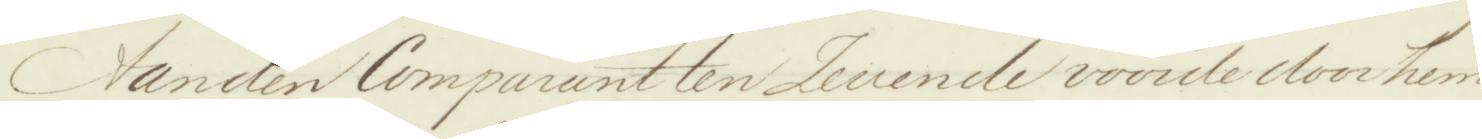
Aan den Comparant ten Zevende voor de door hem
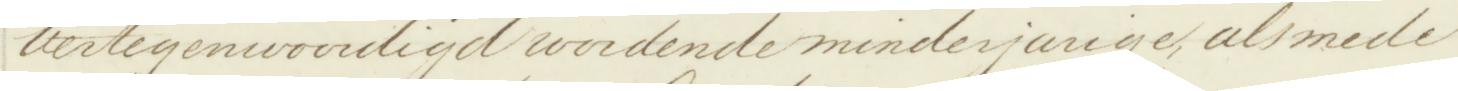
vertegenwoordigd wordende minderjarige, alsmede
